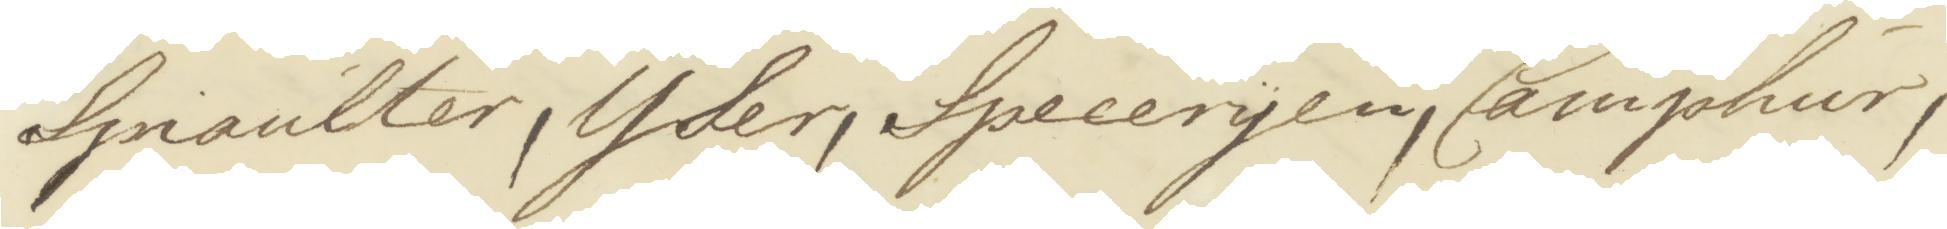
spiaulter, IJser, specerijen, Camphur,
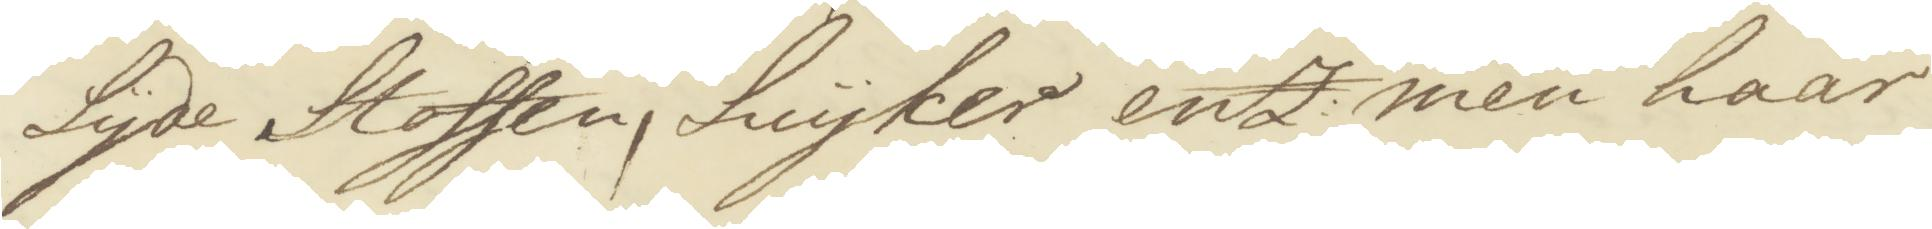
sijde stoffen, suijker enz: men haar
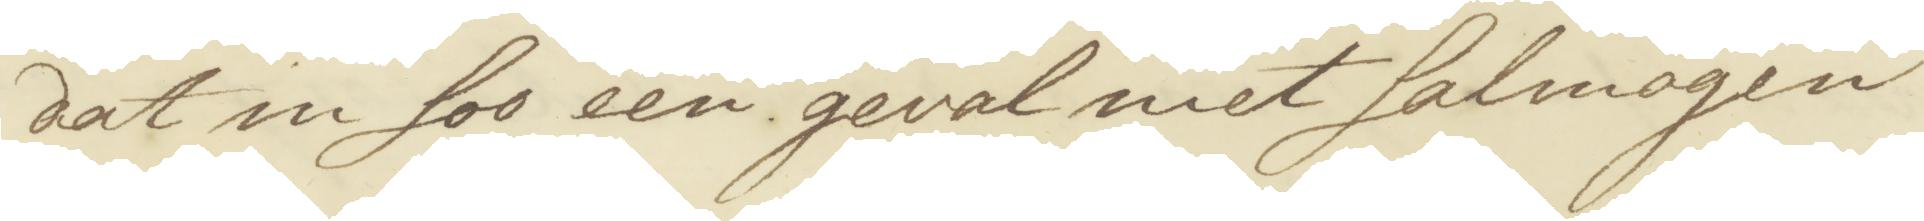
dat in soo een geval niet salmogen
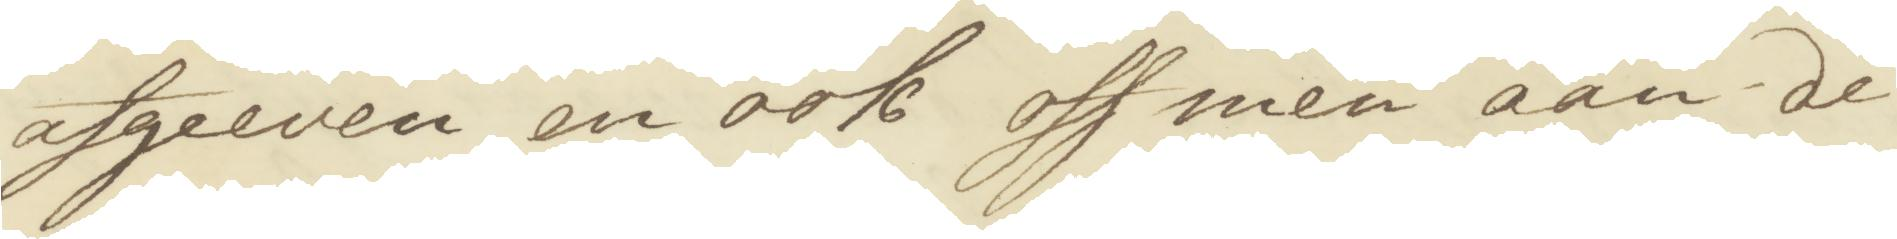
afgeeven en ook off men aan de
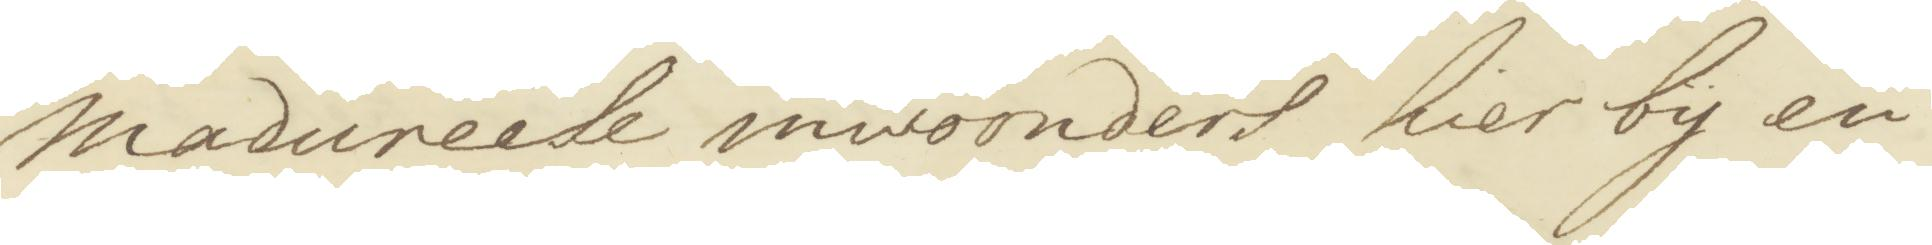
madureese inwoonders hier bij en
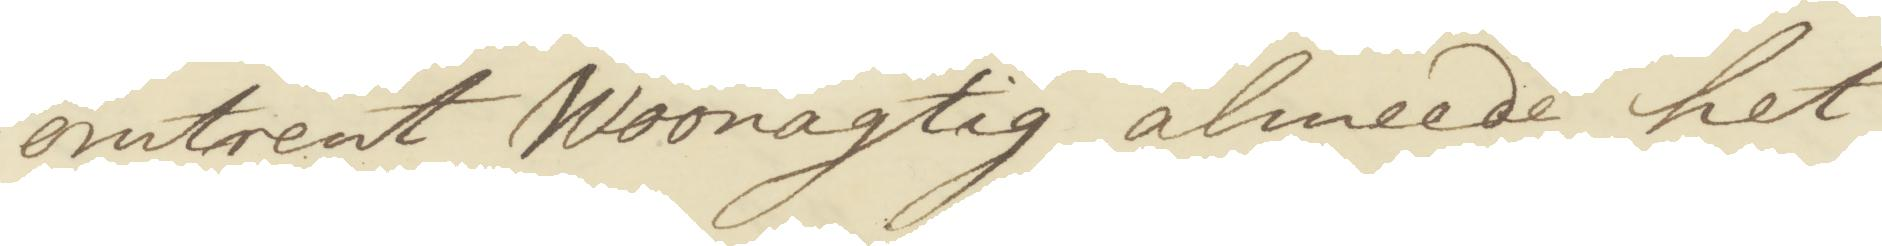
omtrent woonagtig almeede het
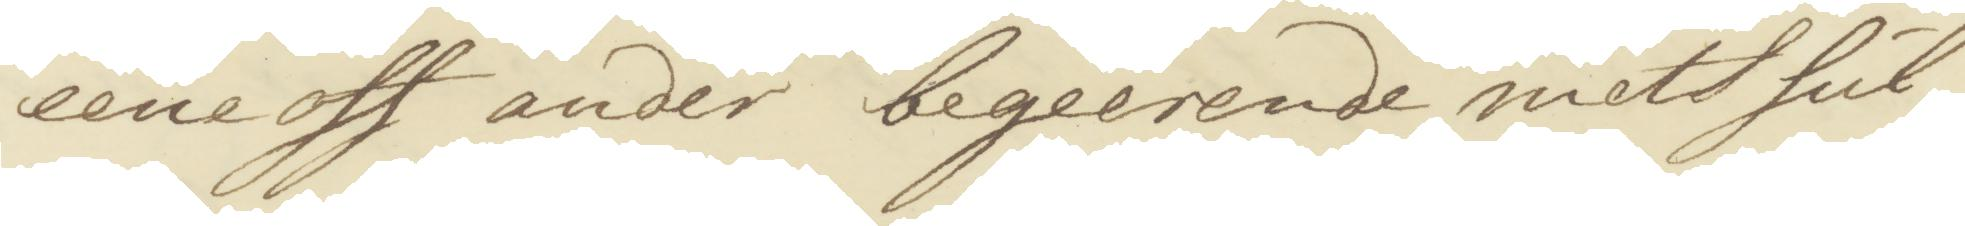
eene off ander begeerende niets sul
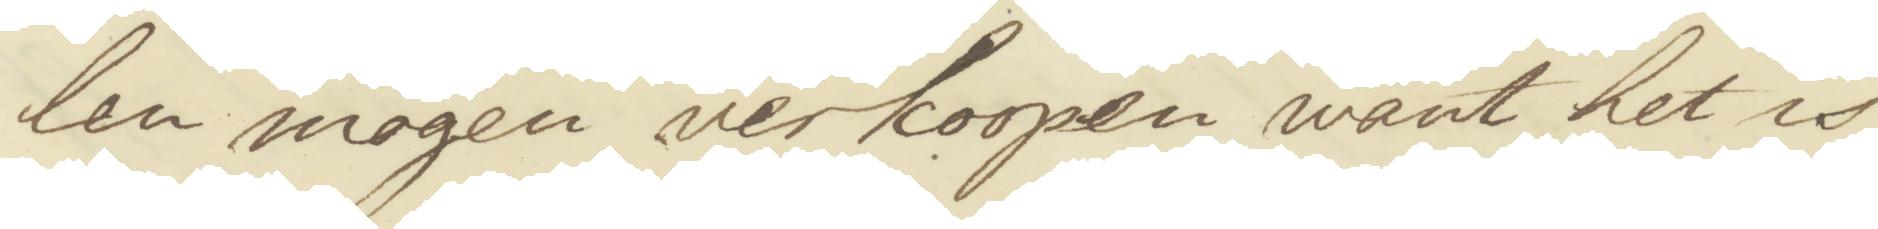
len mogen verkoopen want het is
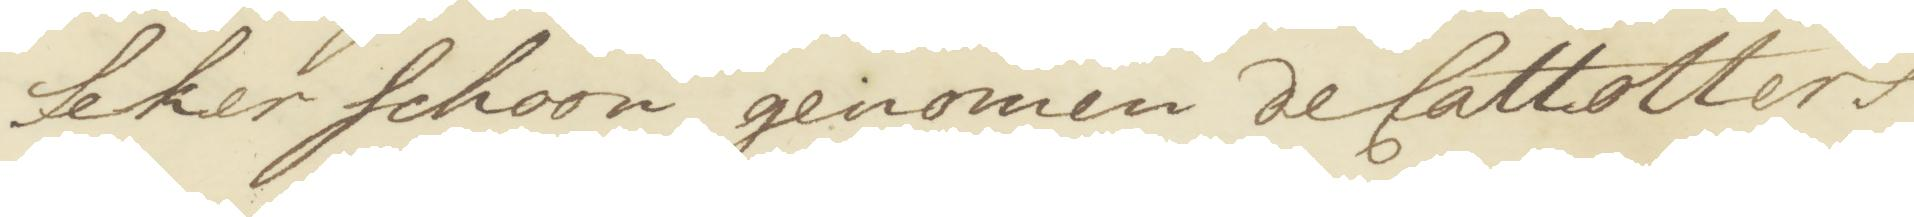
seker schoon genomen de Cattotters
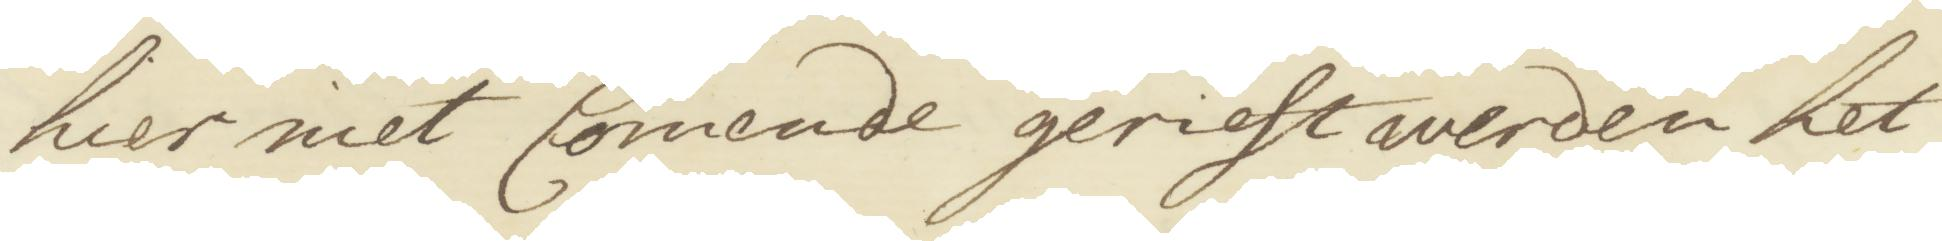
hier niet comende gerieft werden het
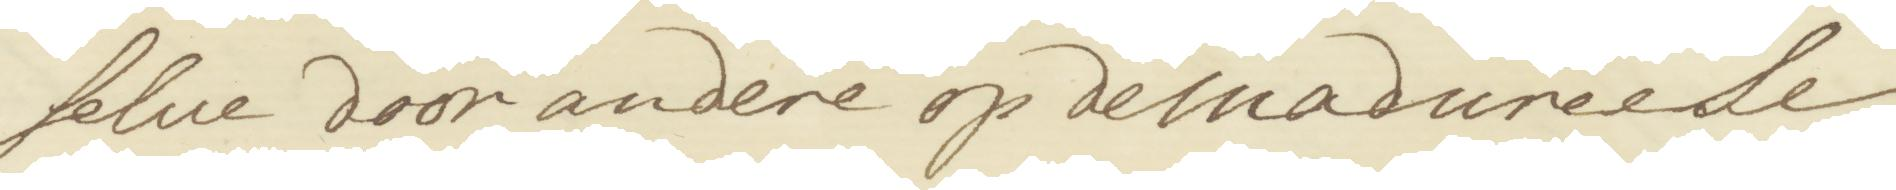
selve door andere op demadureese
